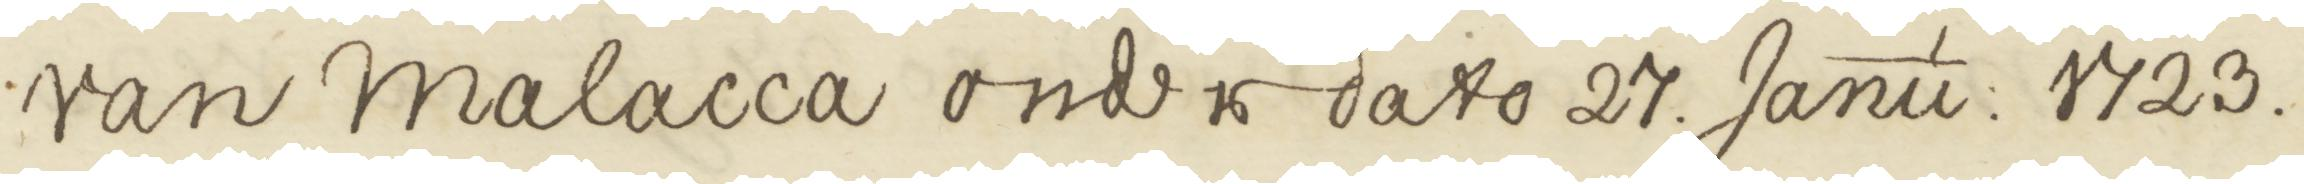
van malacca onder dato 27. Janu: 1723.
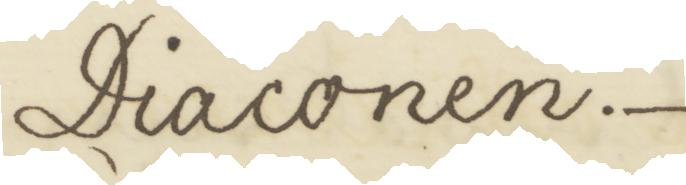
Diaconen.
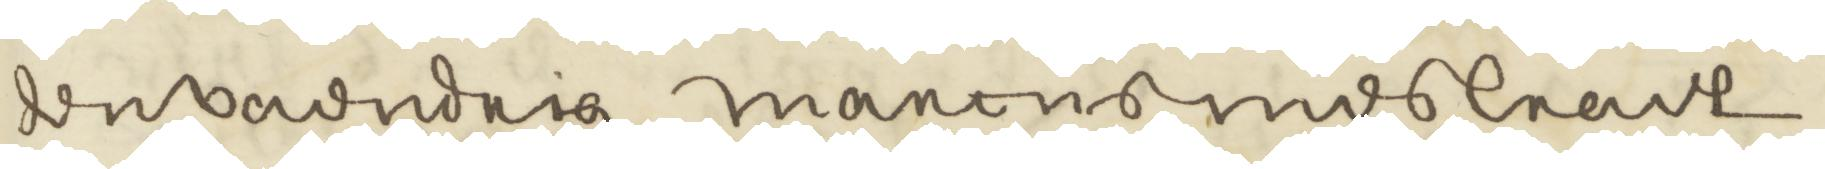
den vaendrig marcus mestrael
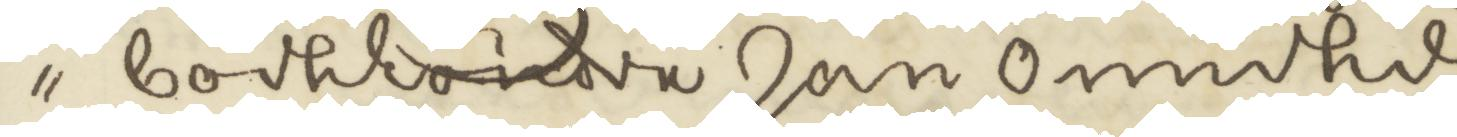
„ boekhouder Jan Onneke
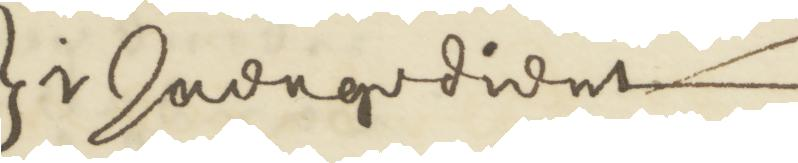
}1 Jaer gedient
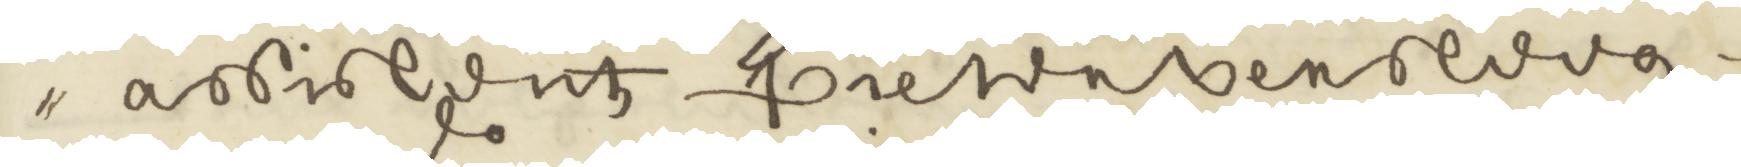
„ assistent pieter versteeg
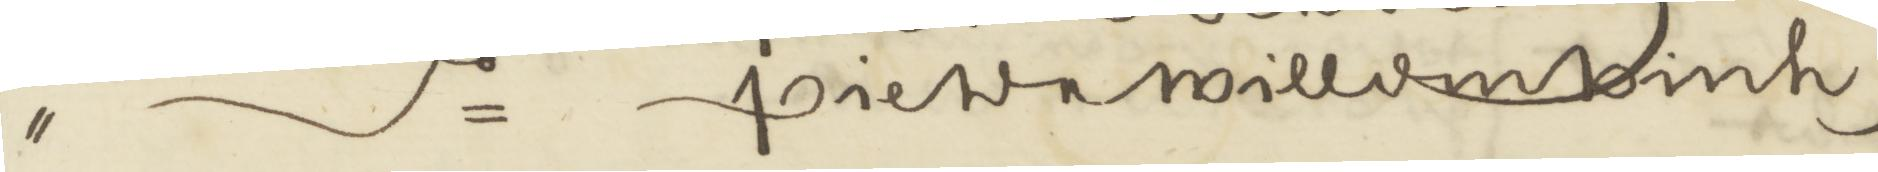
„ D=o pieter willem vink}
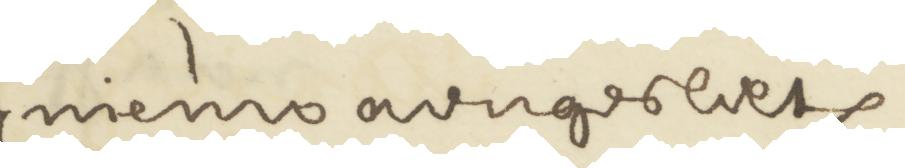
nieuw aengestelt
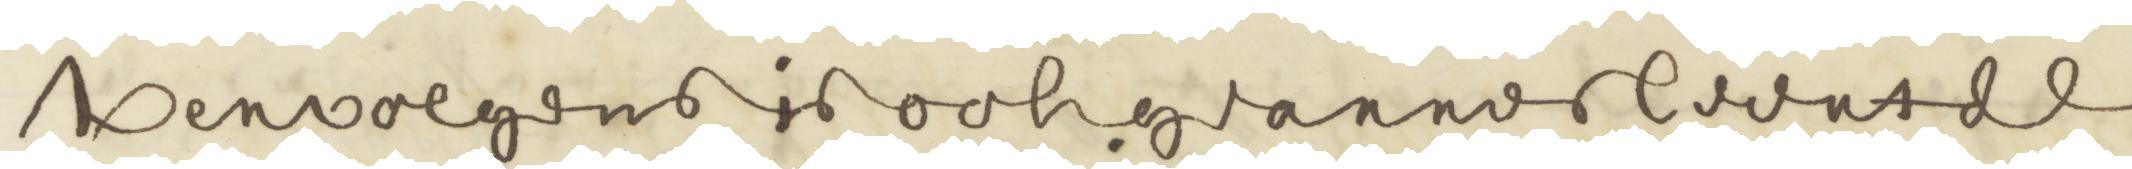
Vervolgens is ook gearresteert de
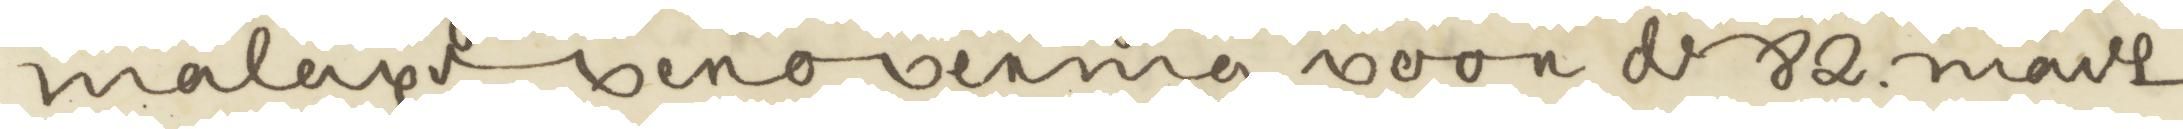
malaxe verovering voor de 82. mael
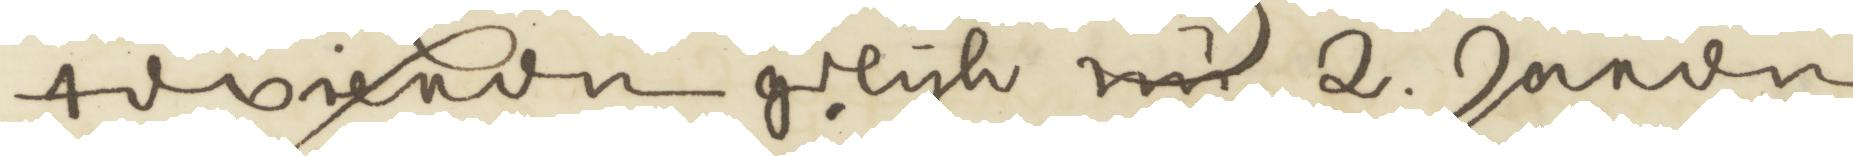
te vieren gelijk nu 2. Jaren
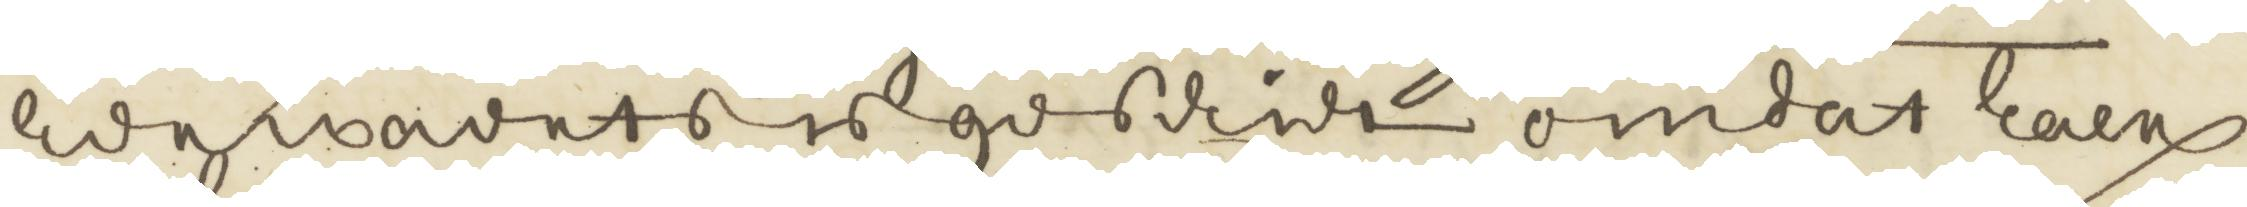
herwaerts is geschiet om dat haer
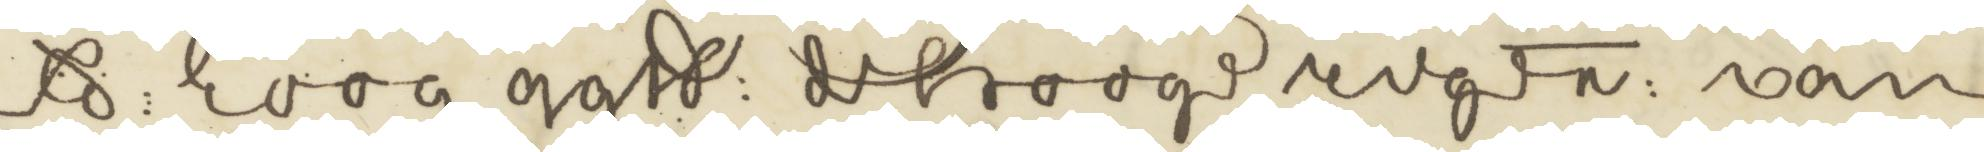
Ed: hoog agtb: de hooge reger: van
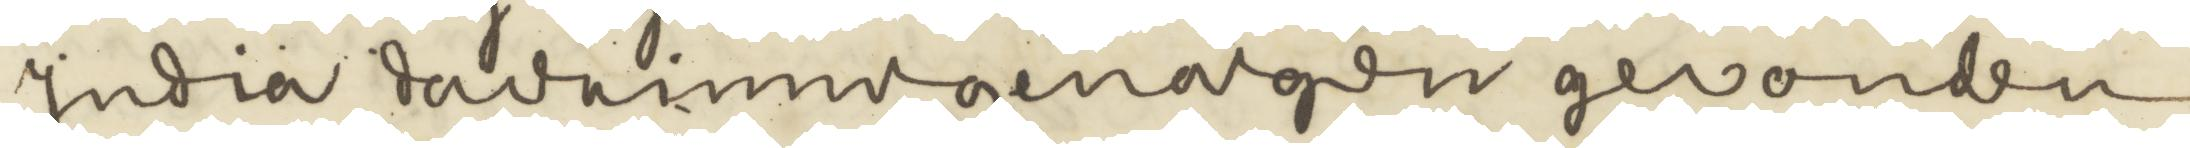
Jndia daerinne genoegen gevonden
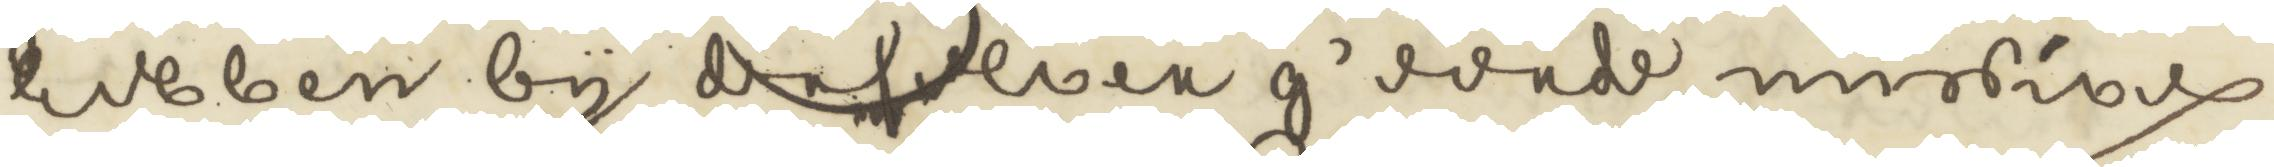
hebben bij derselver g’eerde missive
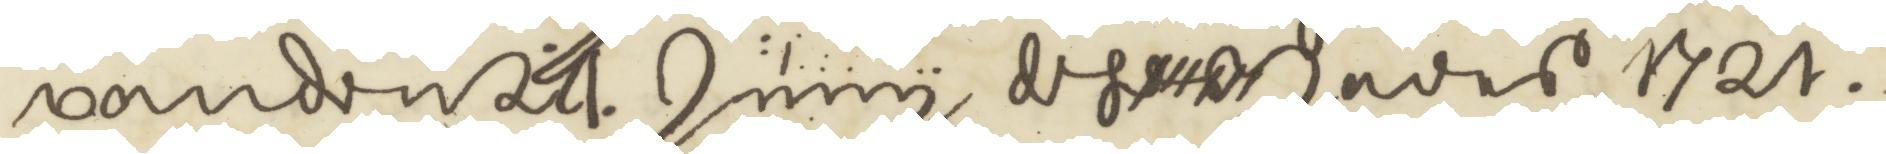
van den 24. Junij deserd Jaers 1721.
